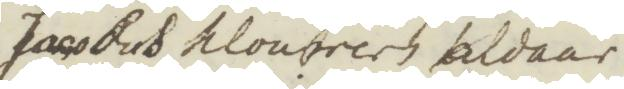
Jacobus Klouwers aldaar
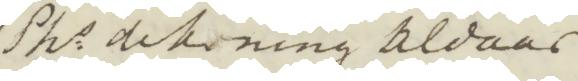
Ph=s de koning aldaar
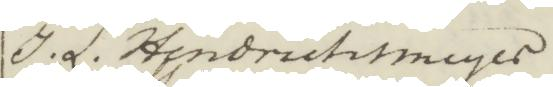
J. L. Hendrichsmeyer
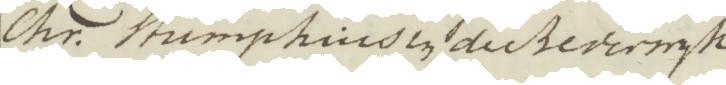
Chr. stumphuis in de Beverwyk
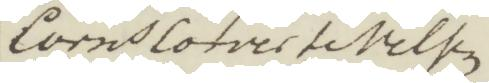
Corns Corver te Velsen
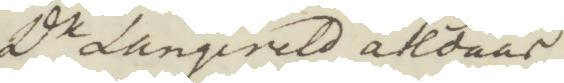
Dk Langeveld aldaar
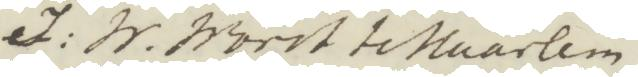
J: W. Worst te Haarlem
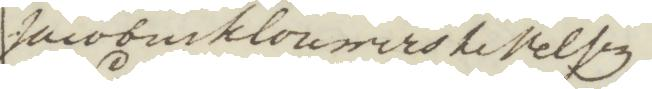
Jacobus klouwers te Velsen
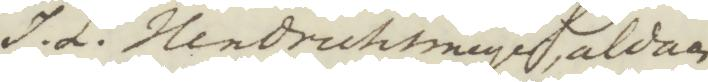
J. L. Hendrichsmeyer, aldaar
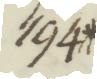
194*
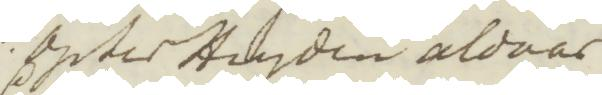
H.k op ter Heyden aldaar
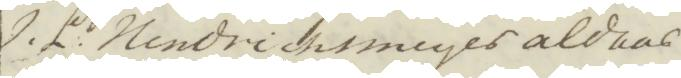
J. L: Hendrichsmeyer aldaar
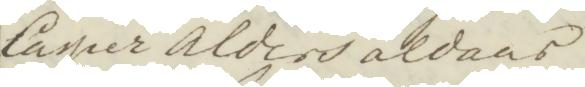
Casper Alders aldaar
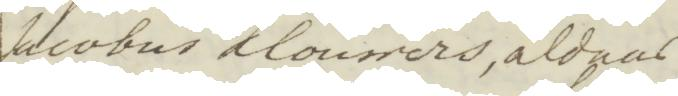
Jacobus klouwers, aldaar
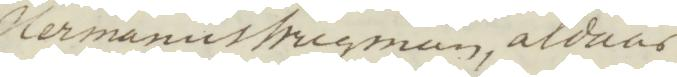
Hermanus Wiegman, aldaar
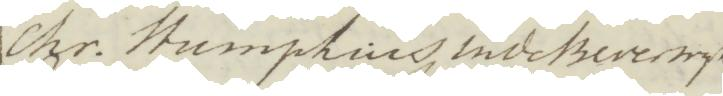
Chr. stumphius in de Beverwyk
